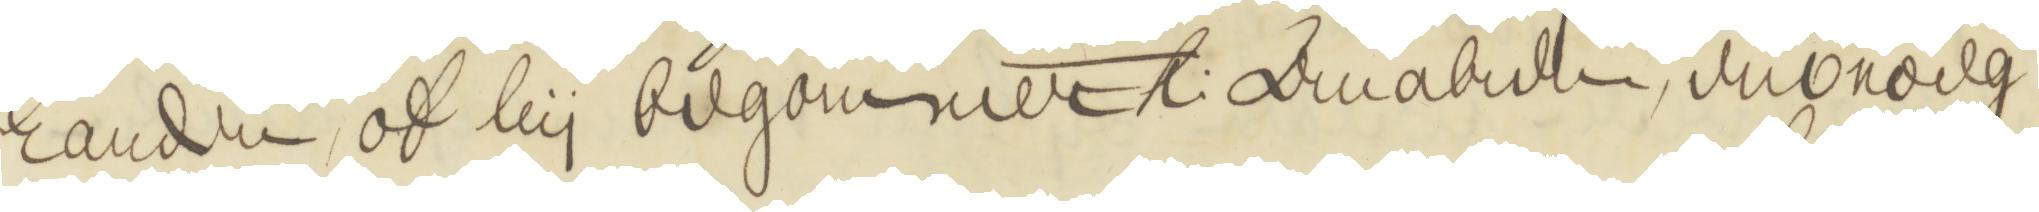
handen, of hij begon werck: te maken, en vroeg
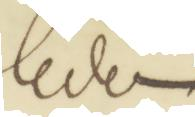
hen
